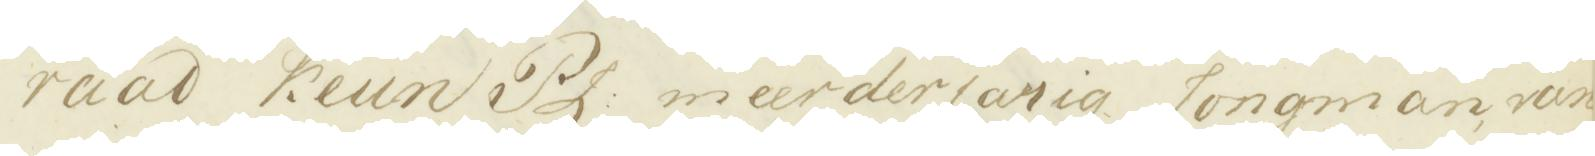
raad Keun Pz. meerderjarig Jongman, van
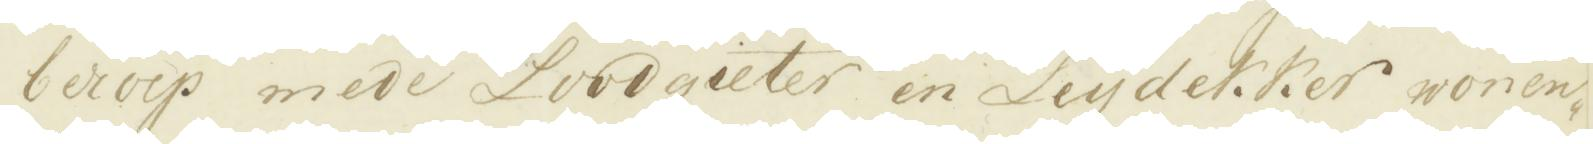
beroep mede Loodgieter en Leydekker wonen„
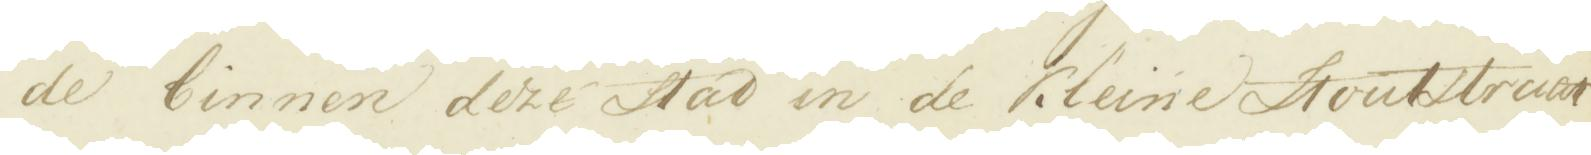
de binnen deze Stad in de Kleine Houtstraat
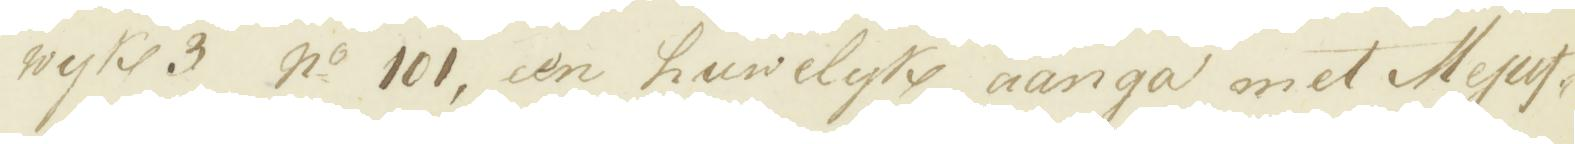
wyk 3 N=o 101, een huwelyk aanga met Mejuf„
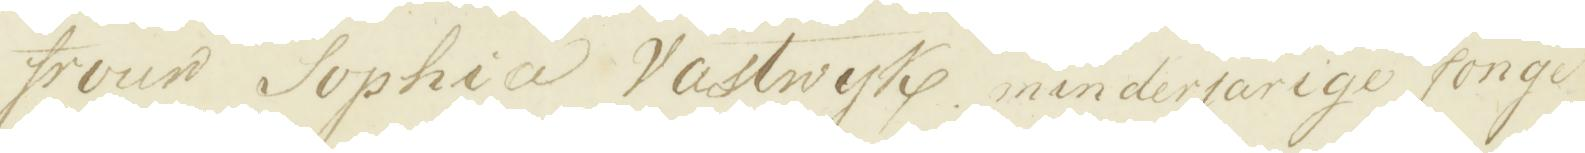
frouw Sophia Vastwyk, minderjarige Jonge
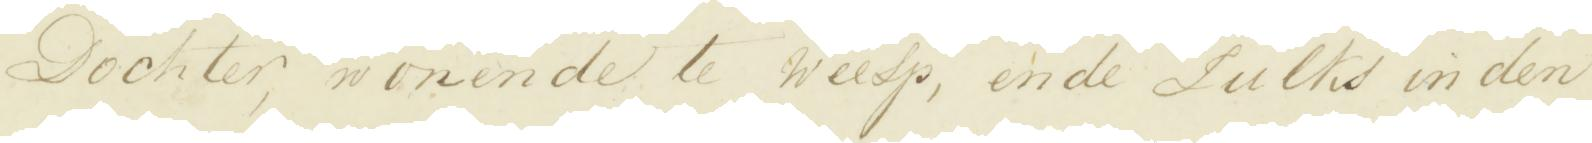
Dochter, wonende te weesp, ende zulks in den
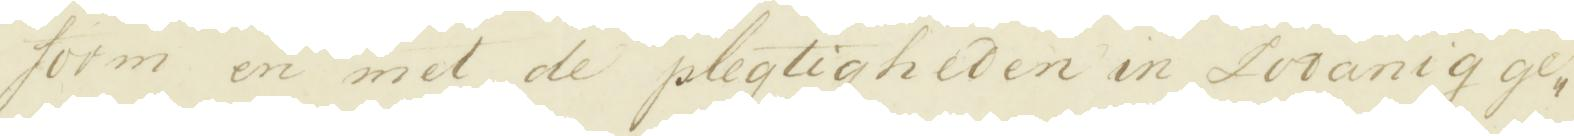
form en met de plegtigheden in zodanig ge„
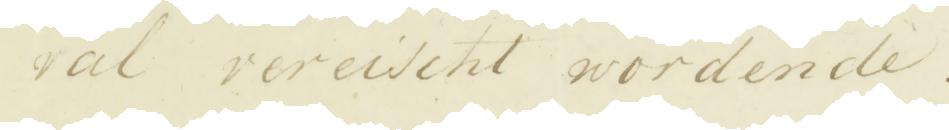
val vereischt wordende.
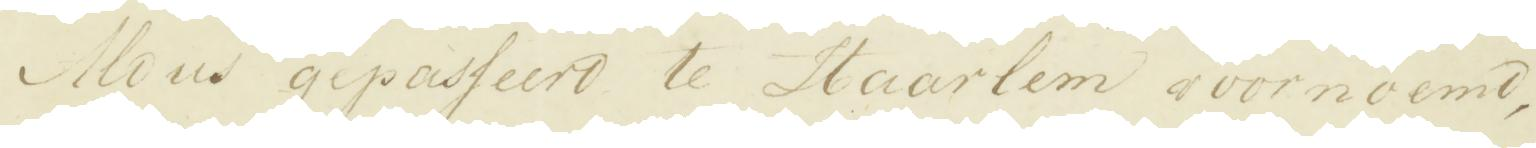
Aldus gepasseerd te Haarlem voornoemd,
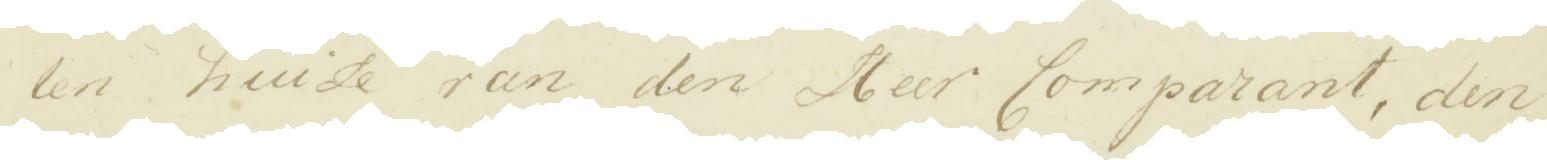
ten huize van den Heer Comparant, den
